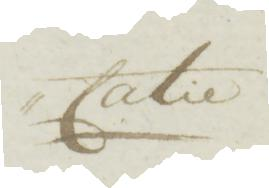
„catie
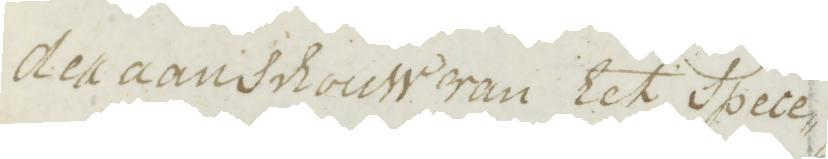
der aanschouw van het spece„
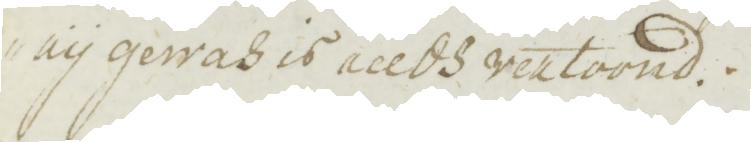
„rij gewas is reeds vertoond.
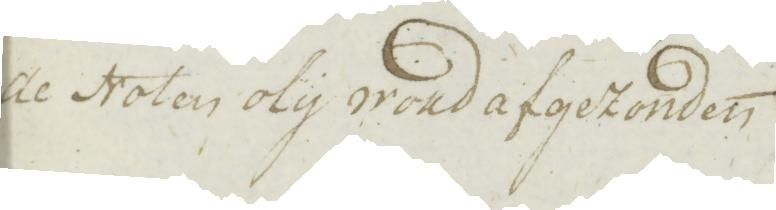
de Noten olij word afgezonden
